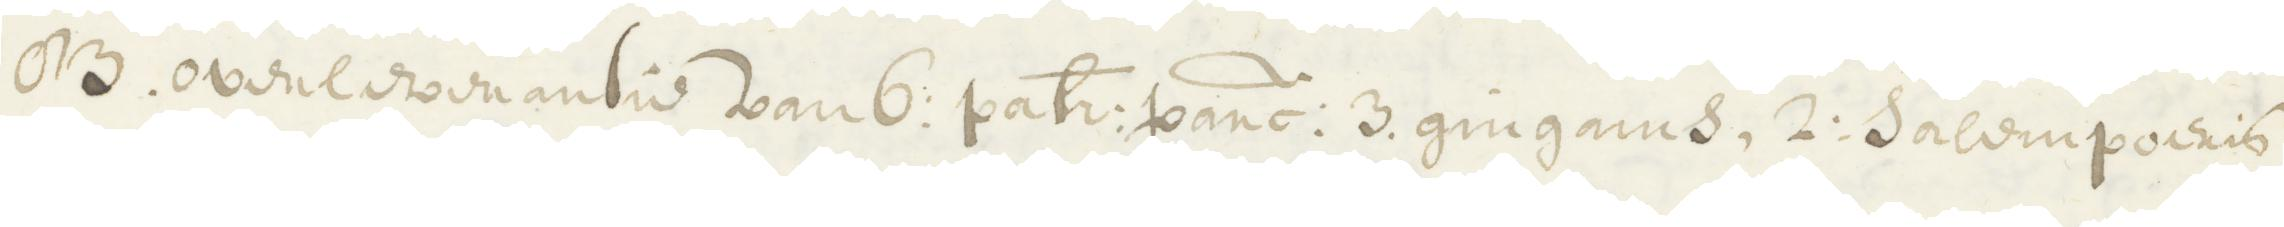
83. over leverantie van 6: pak: parc: 3. gingams, 2: salempoeris
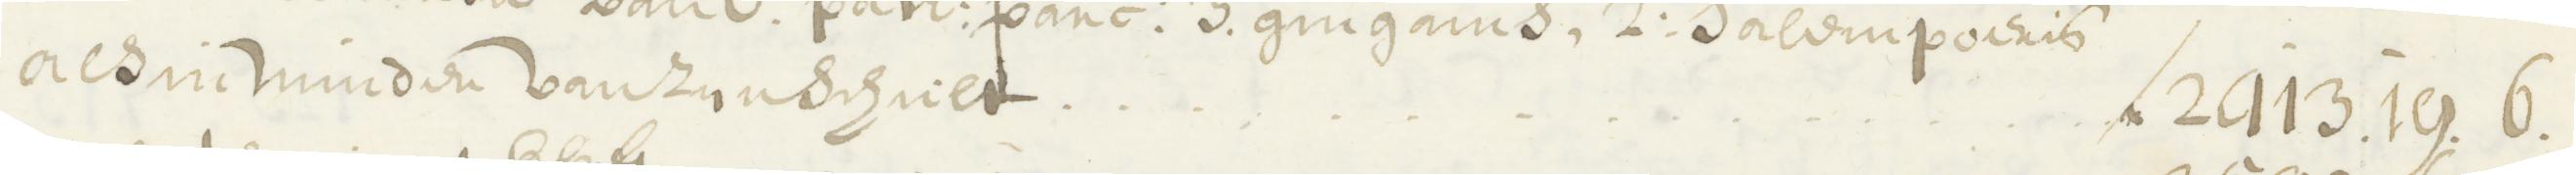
als in minder vanzynschult - - - - - - - - - - - - - - ƒ 2413. 19. 6.
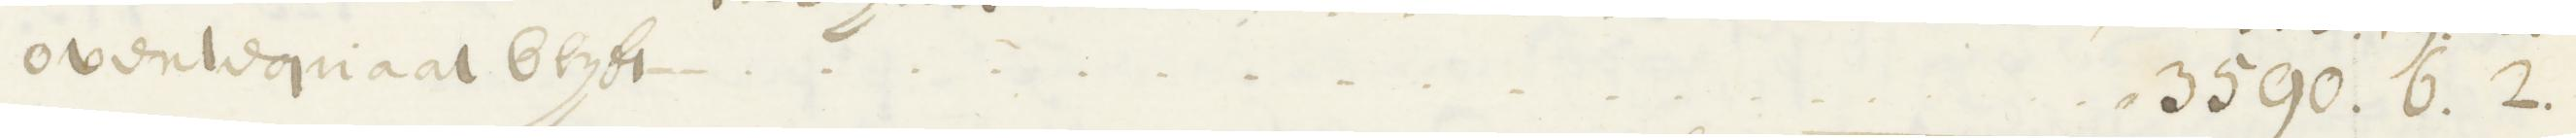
overtequaat blyft - - - - - - - - - - - - - - - - - - „ 3590. 6. 2.
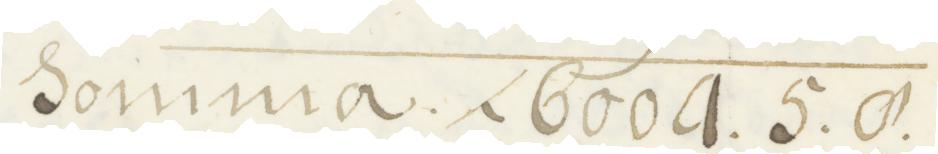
Somma ƒ 6004. 5. 8.
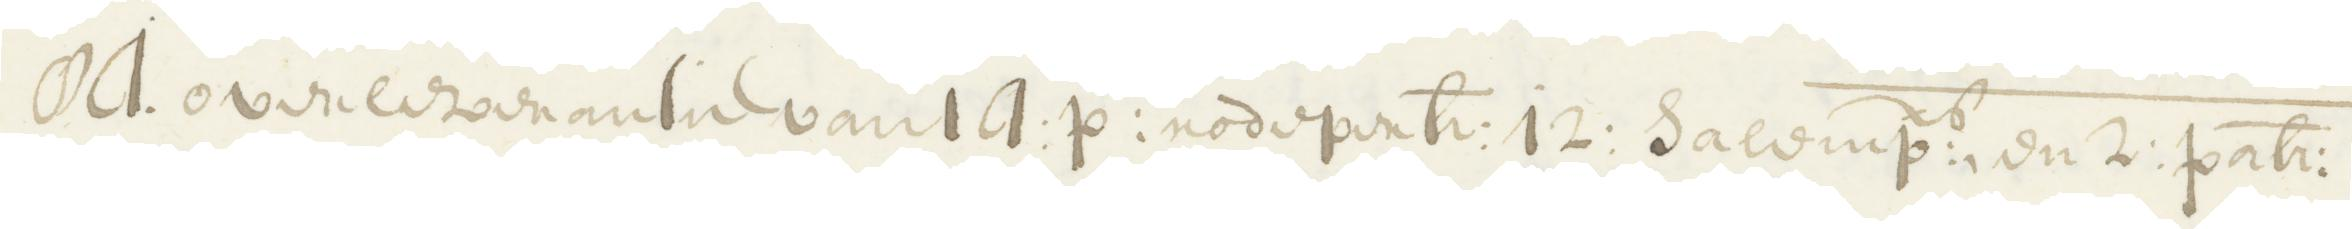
84. overleverantie van 14: p:ken rodeperk: 12: salemp:s, en 2: pak:
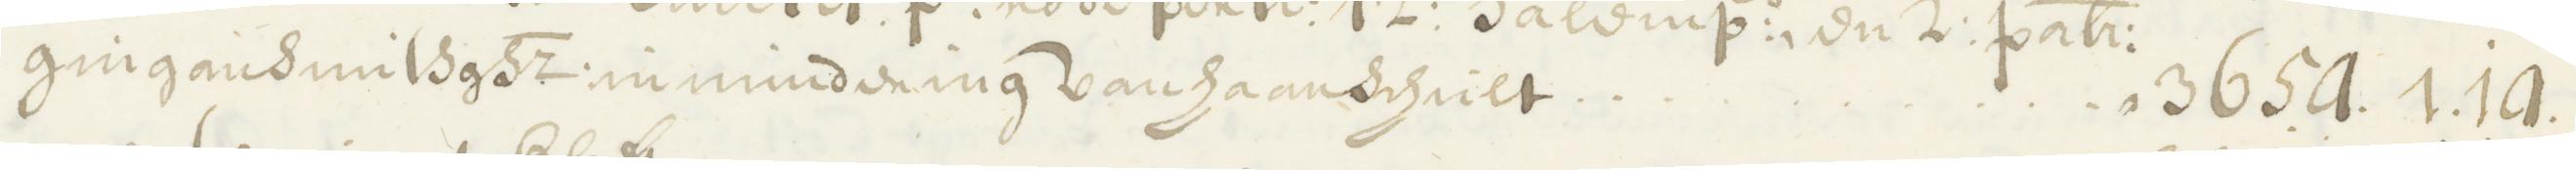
gingans mitsgsz: in mindering van haarschult - - - - - - - - - - „ 3654. 1.14.
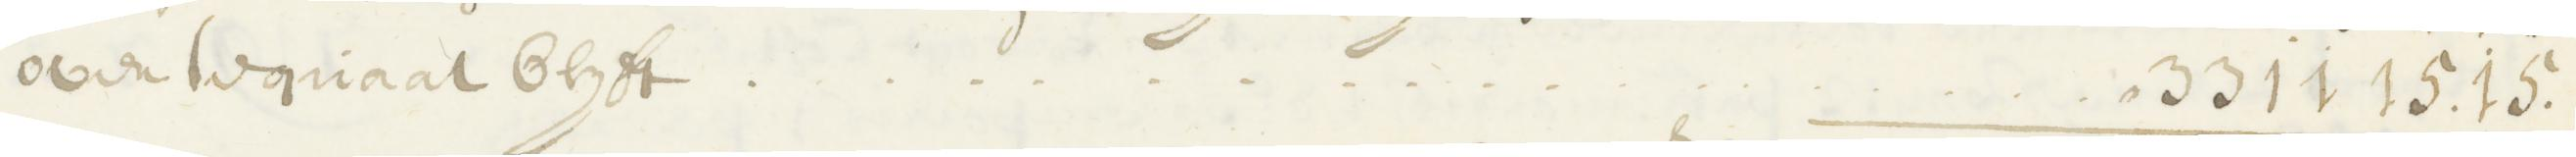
over tequaat blyft - - - - - - - - - - - - - - - - - - „ 3311 15.15.
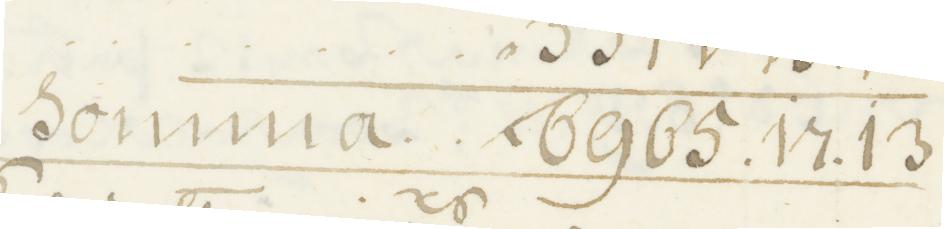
Somma ƒ 6965. 17. 13
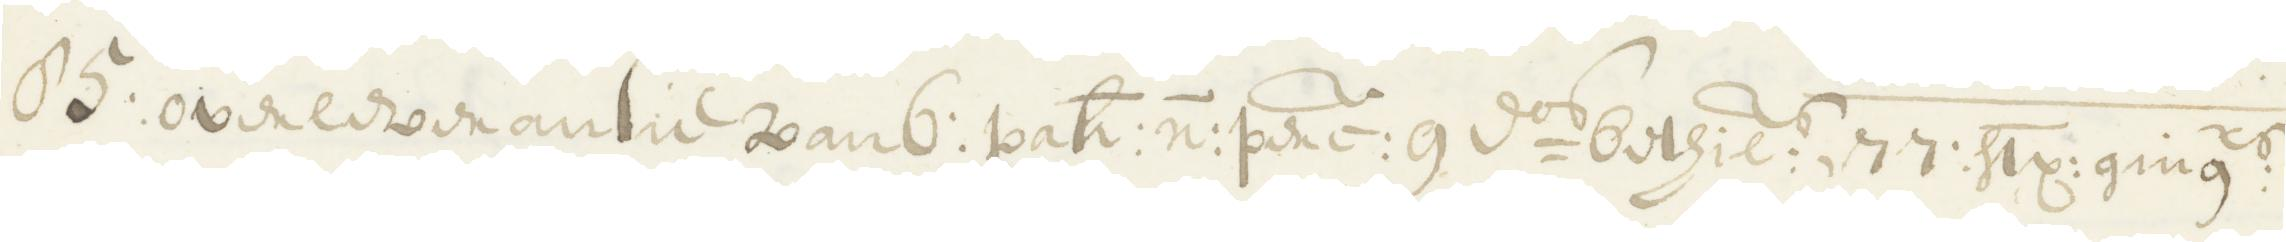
85: overleverantie van 6: pak: r: perc: 9 d=os bethil:s 77: stx: ging:s
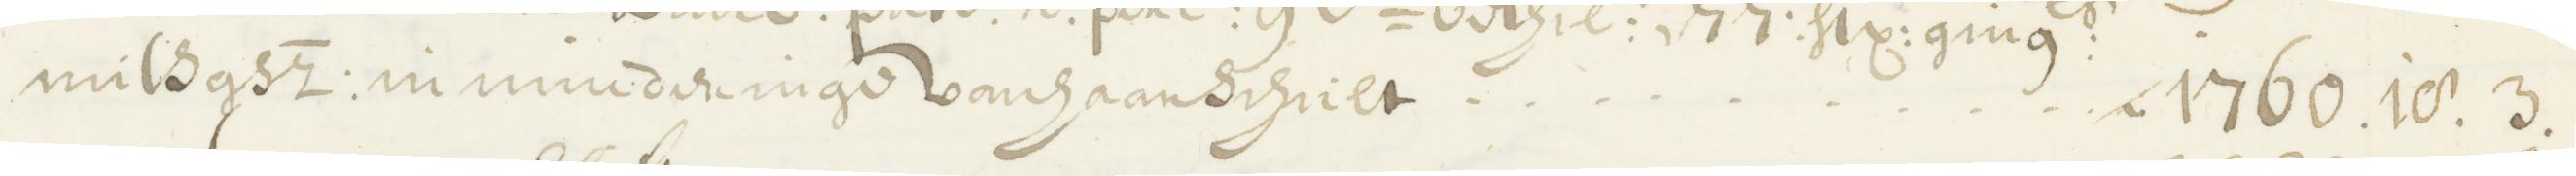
mitsgsz: in minderinge vanhaarschult - - - - - - - - - ƒ 1760.18. 3.
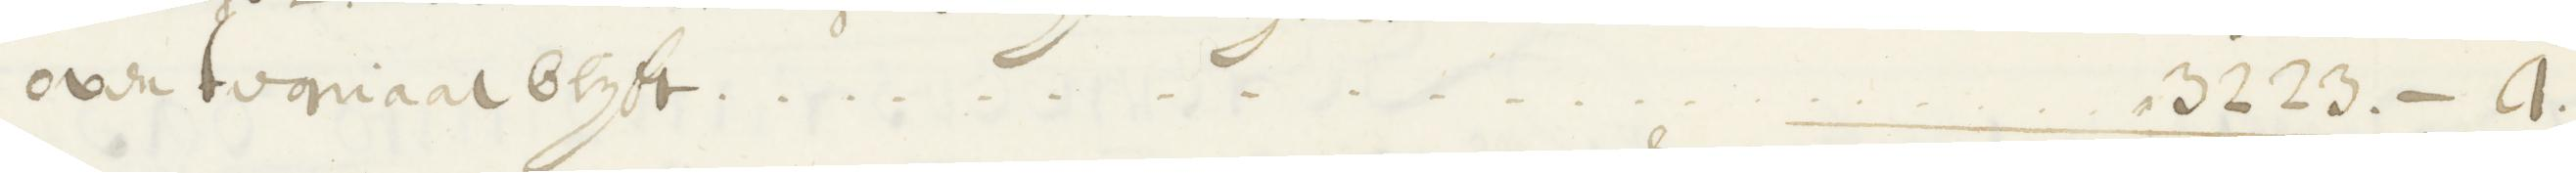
over tequaat blyft - - - - - - - - - - - - - - - - - - - - „ 3223.— 4.
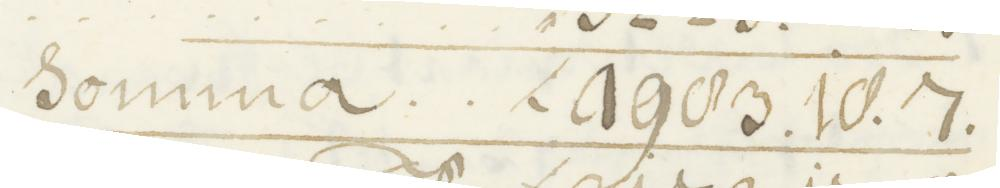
Somma - - ƒ 4983.18. 7.
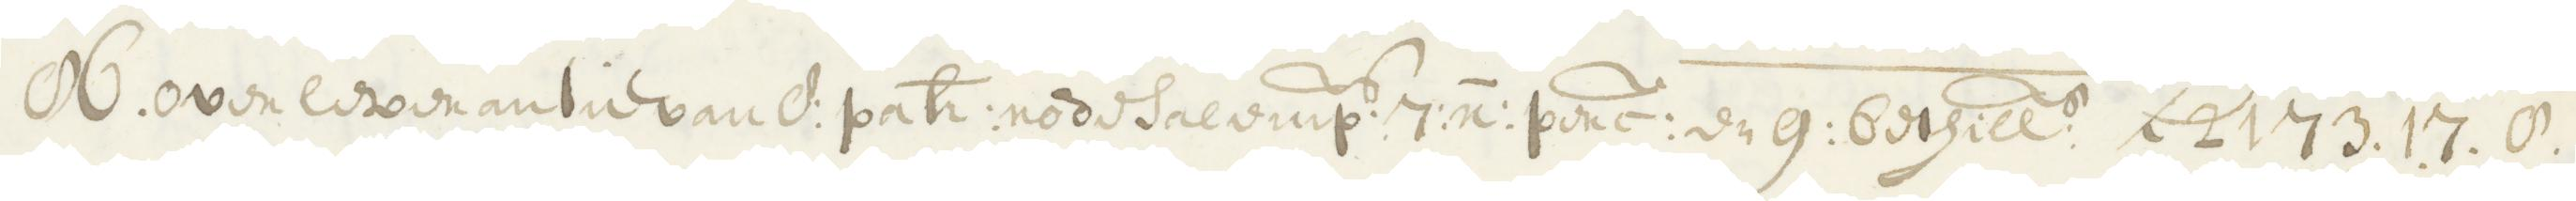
86. overleverantie van 8: pak: rodesalemp:s 7: r: perc: en 9: bethill:s ƒ 2173.17. 8.
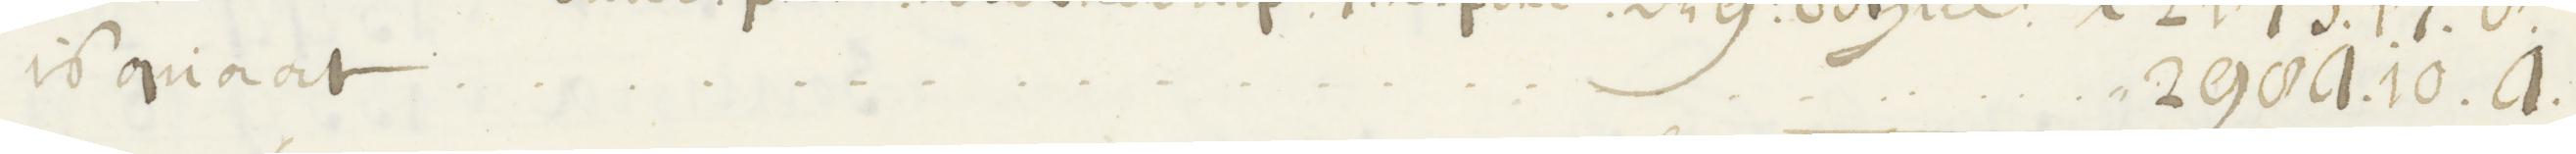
is quaat - - - - - - - - - - - - - - - - - - - - - „ 2984.10. 4.
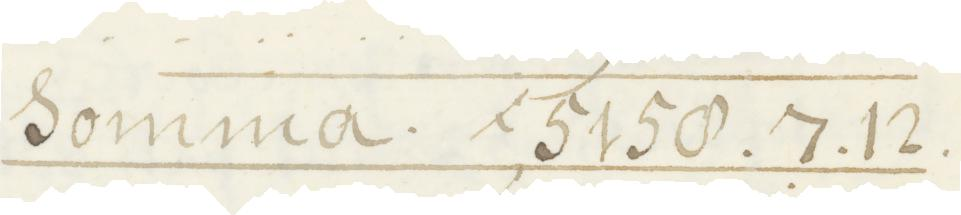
Somma ƒ 5158. 7.12.
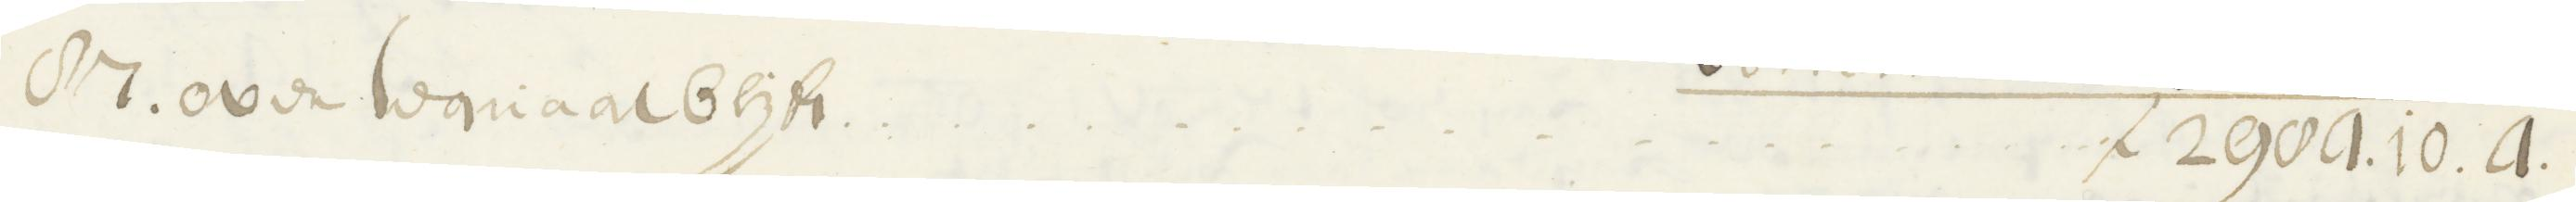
87. over tequaat blijft - - - - - - - - - - - - - - - - - ƒ 2984.10. 4.
